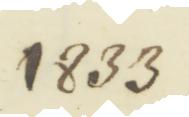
1833
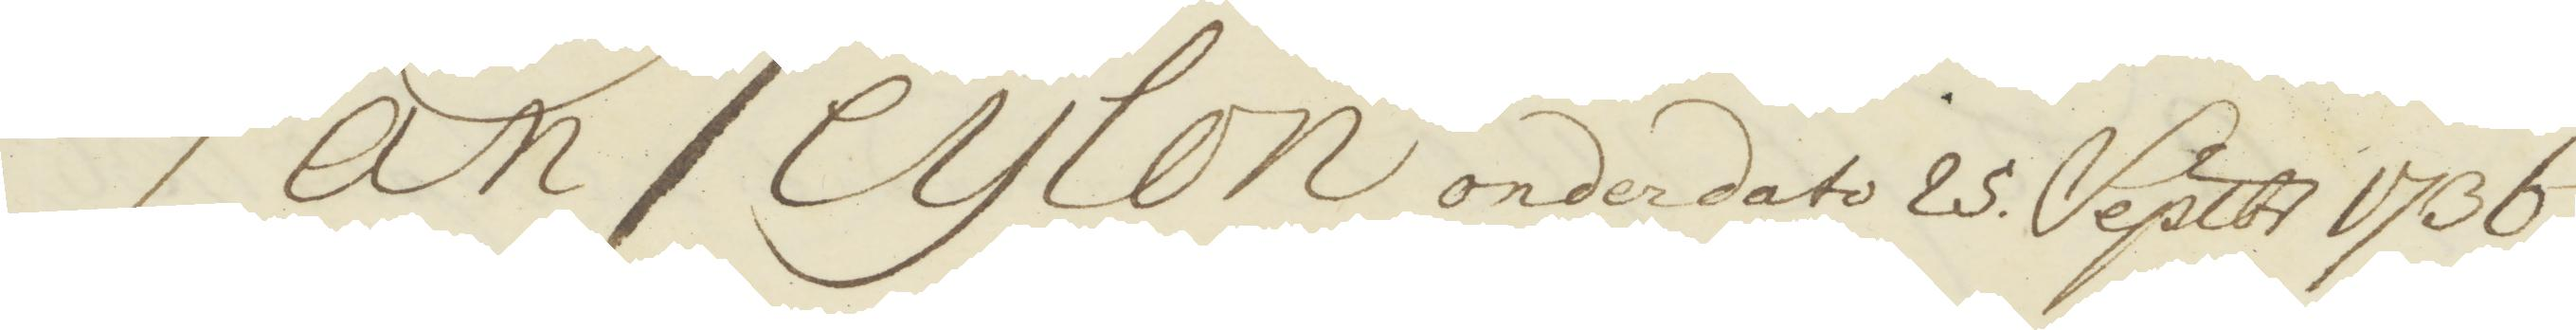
Van Ceijlon onder dato 25. Septbr 1736,
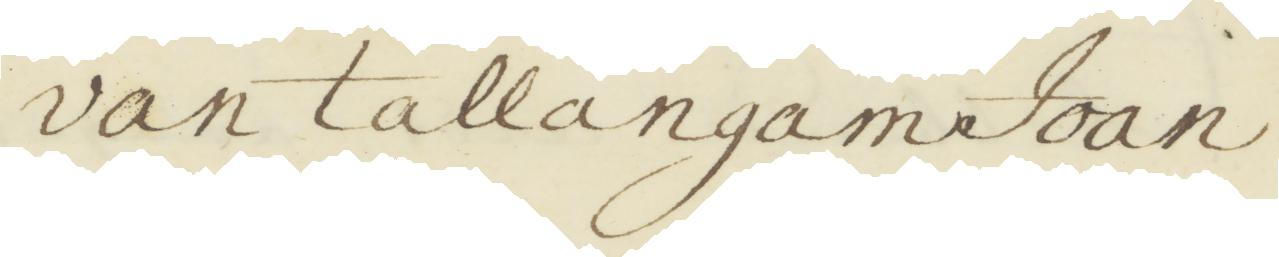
van tallangam Ioan
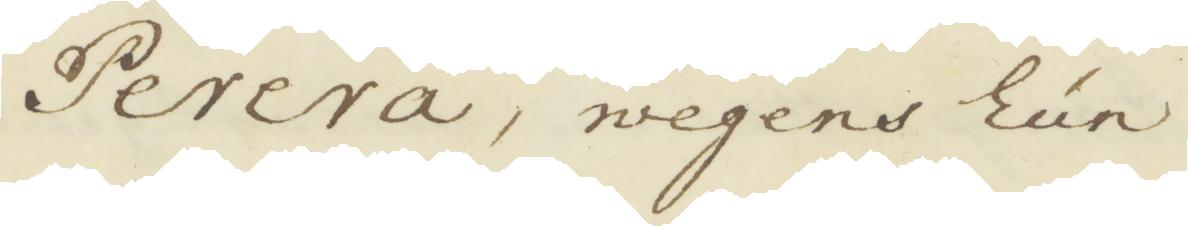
Perera, wegens hun
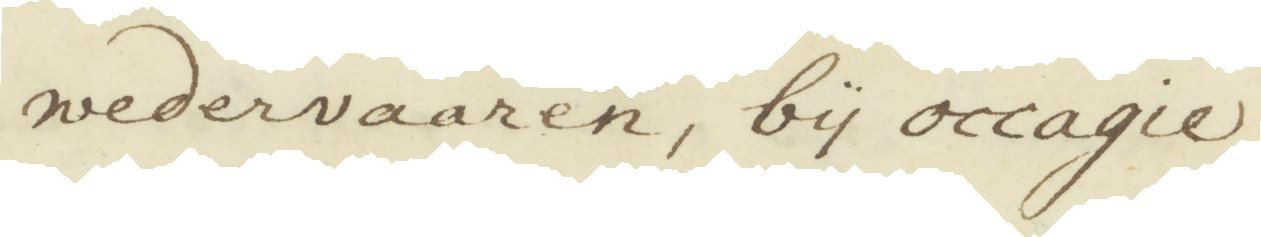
wedervaaren, bij occagie
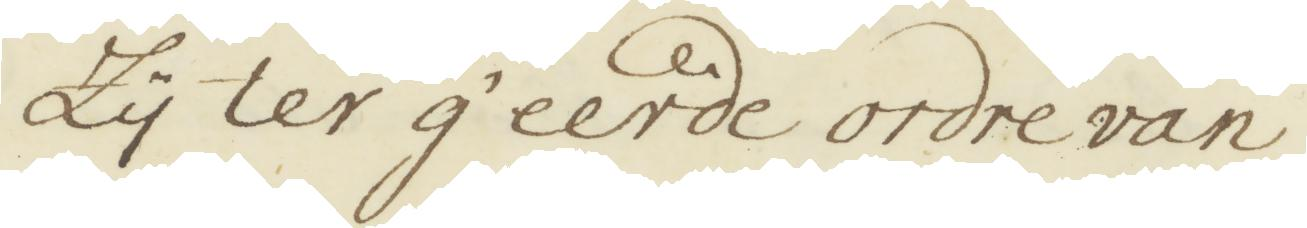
zij ter g’eerde ordre van
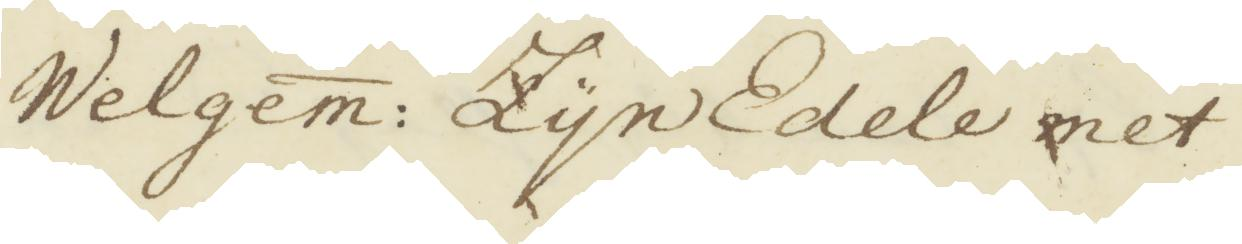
Welgem: zijn Edele met
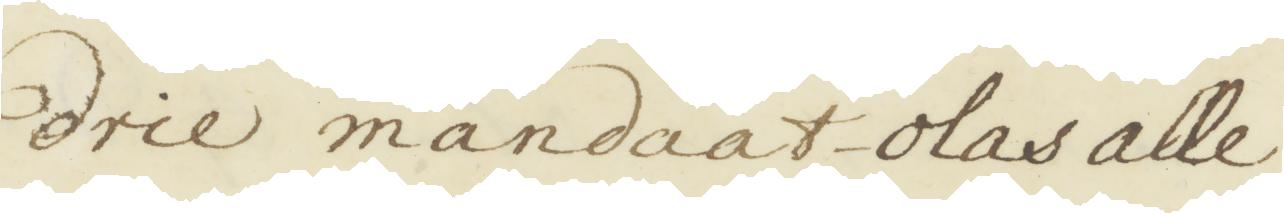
drie mandaat-olas alle
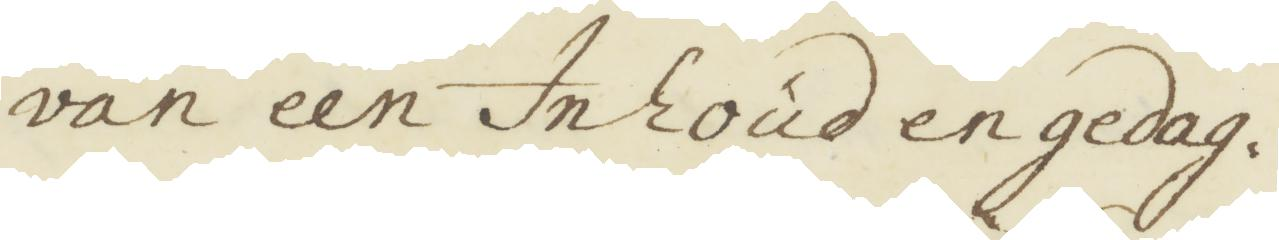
van een Inhoud en gedag„
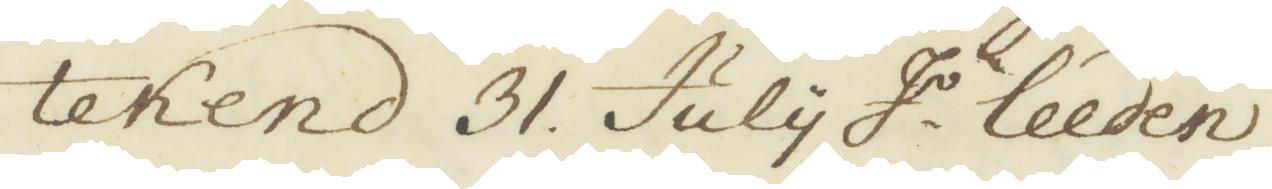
tekend 31. Iulij J-o leeden
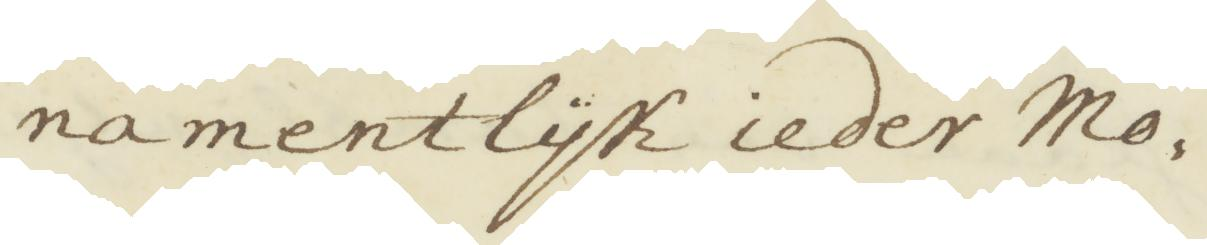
namentlijk ieder Mo„
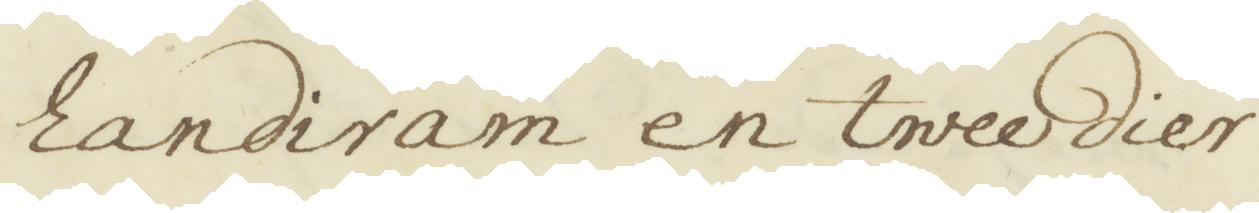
handiram en twee dier
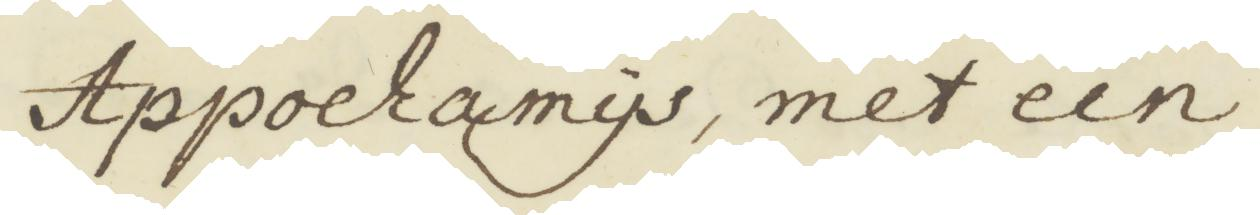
Appoehamijs, met een
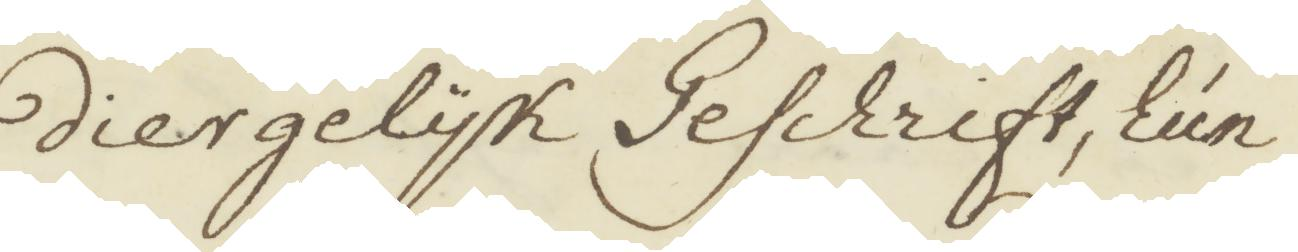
diergelijk Geschrift, hun
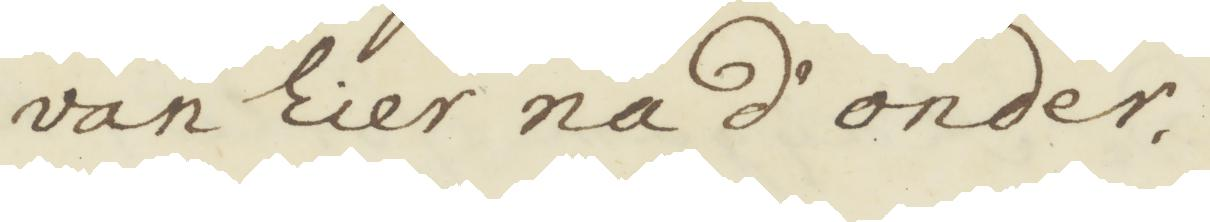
van hier na d’ onder„
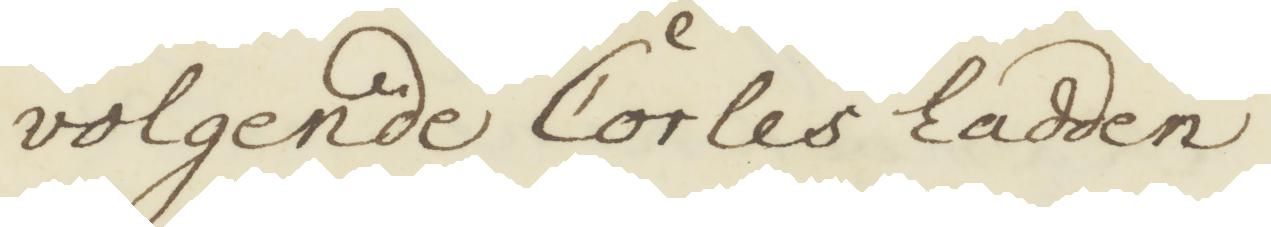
volgende Corles hadden
